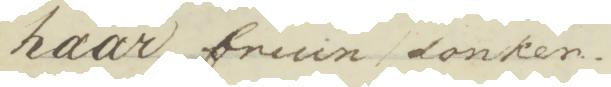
haar, bruin / donker.
